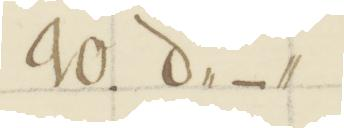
40. d„os „
